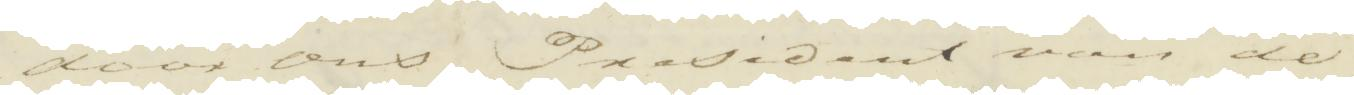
door ons President van de
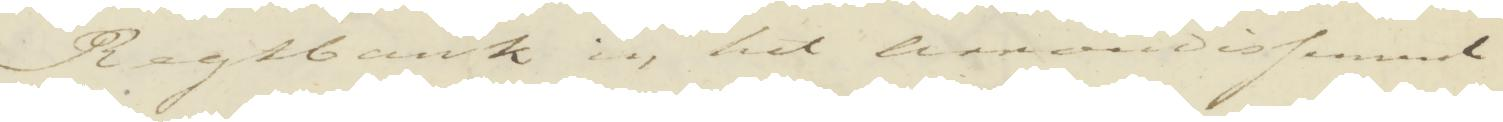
Regtbank in het arrondissement
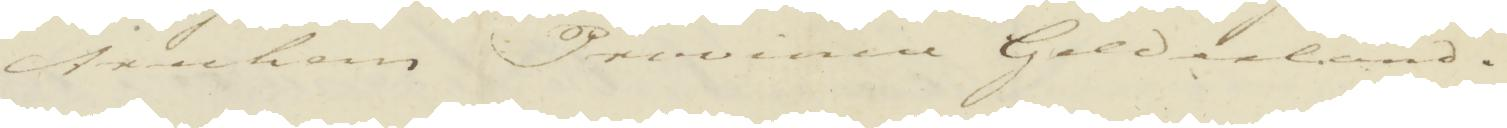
Arnhem Provincie Gelderland.
